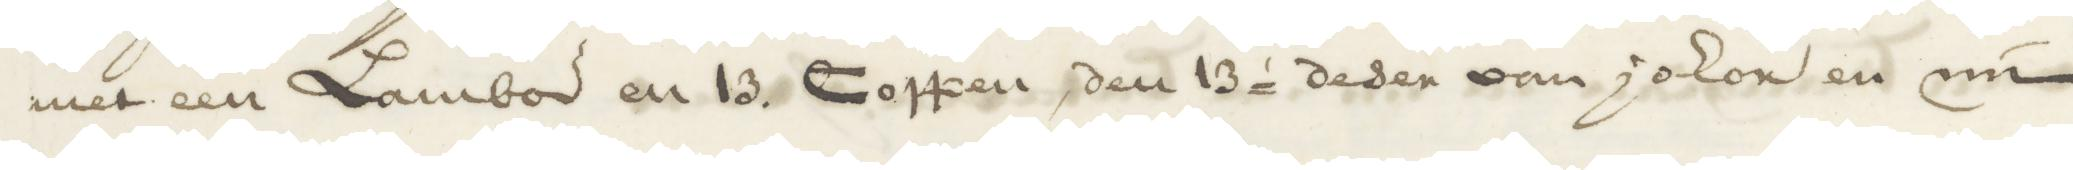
met een Lamboe en 13. Coppen, den 13=' deser van johon en nu
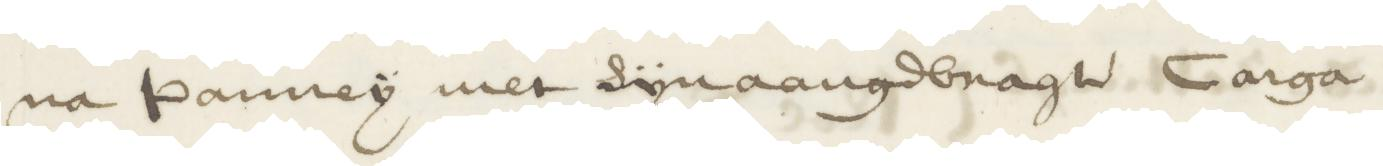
na Panneij met sijn aangebragte Cargo
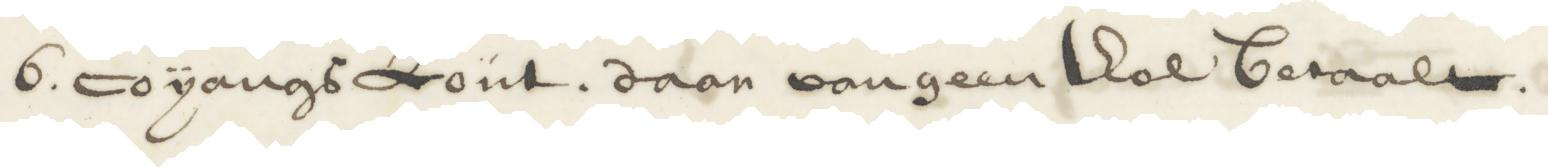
6. coijangs Zout. daar van geen thol betaalt.
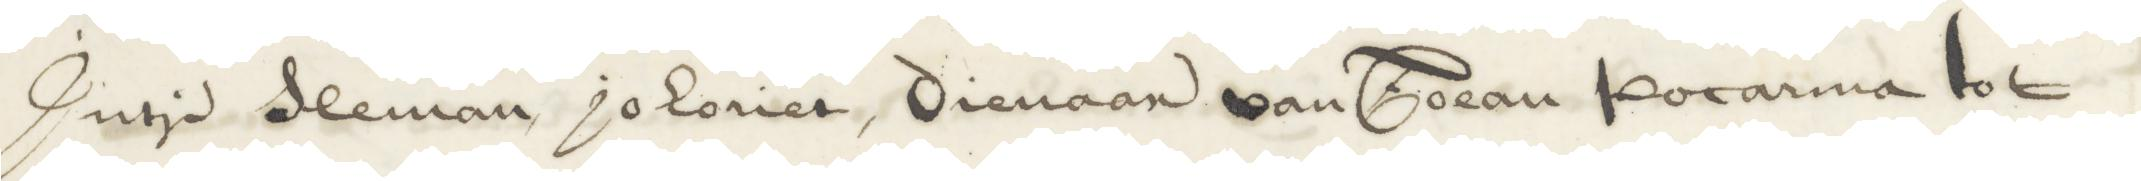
Jntje Sleman johoriet, dienaar van Toean Pocarma tot
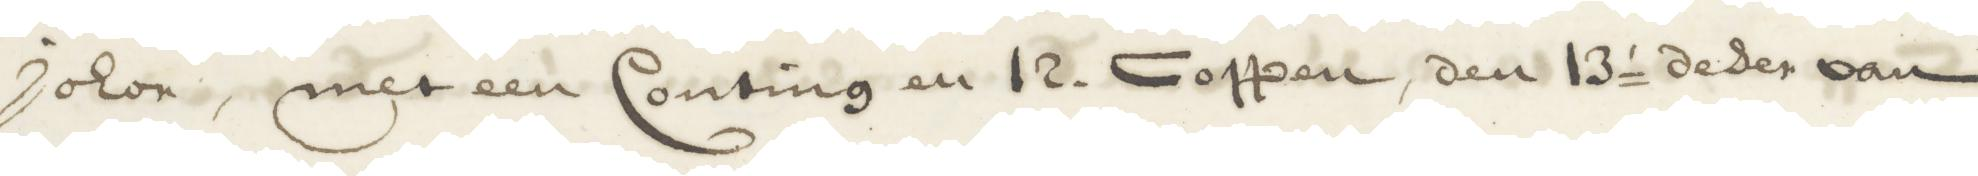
johor, met een Conting en 12. Coppen, den 13=' deser van
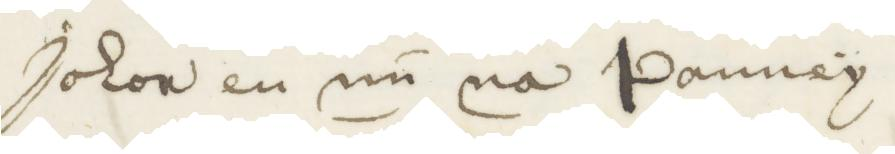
johor en nu na Panneij
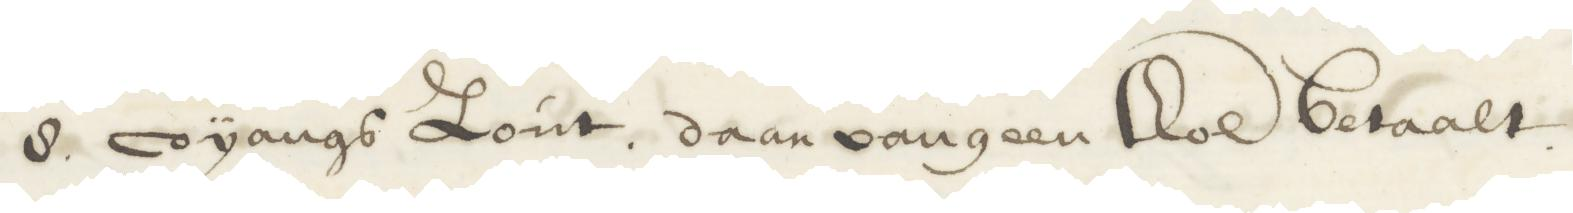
8. coijangs Zout. daar van geen thol betaalt.
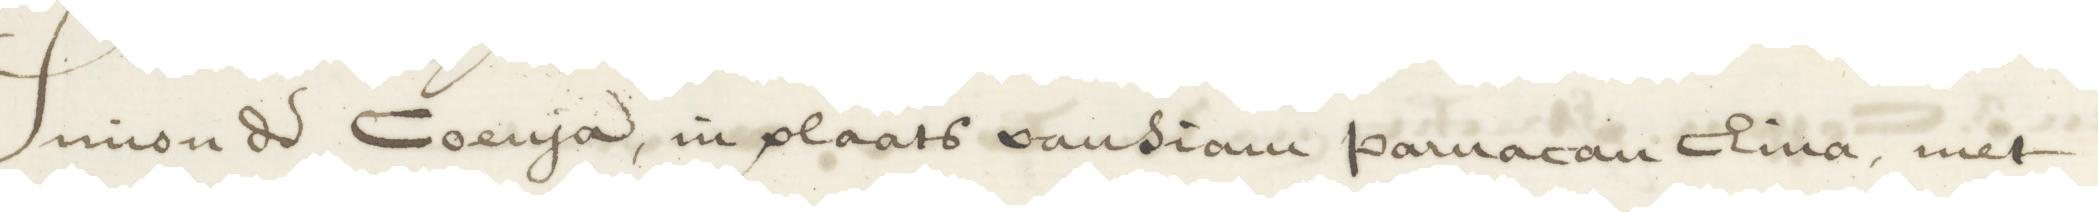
Simon de Coenja, in plaats van siam pamacan china, met
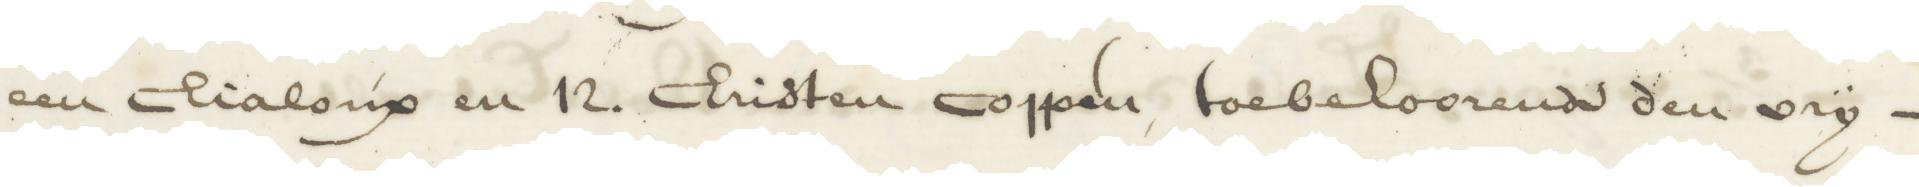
een chialoup en 12. christen coppen, toebehoorende den vrij -
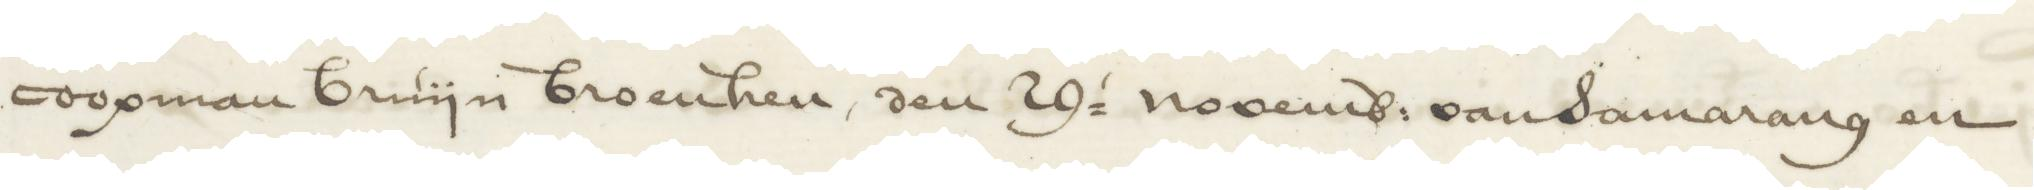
coopman bruijn broenken, den 29=' novemb: van Samarang en
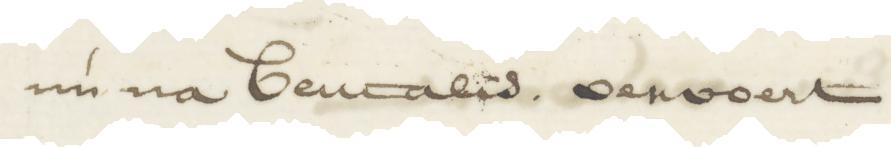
nu na bencalis. vervoert
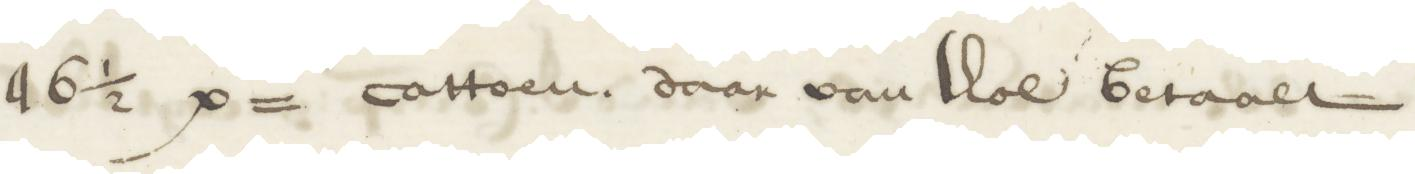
46½ p=es cattoen. daar van thol betaalt
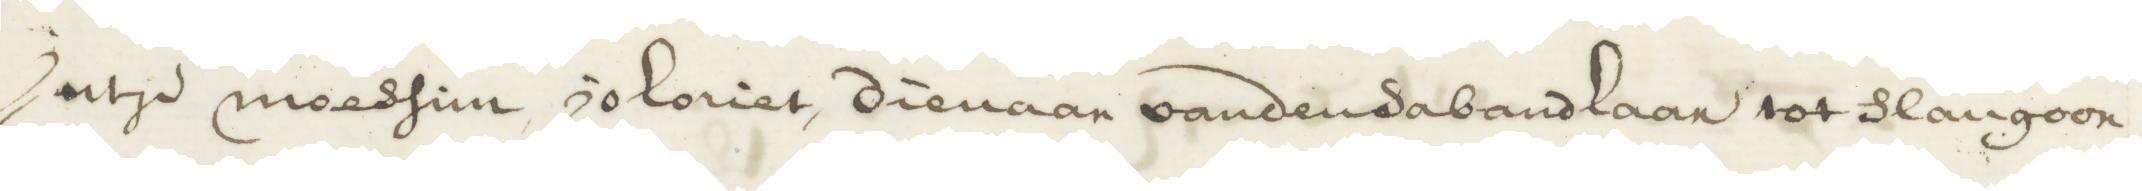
Jntje moessim, johoriet, dienaar van den sabandhaar tot slangoor
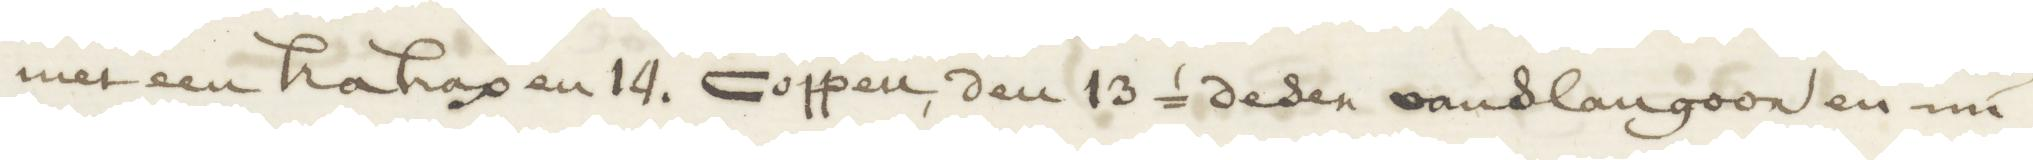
met een kakap en 14. Coppen, den 13=' deser van slangoor en nu
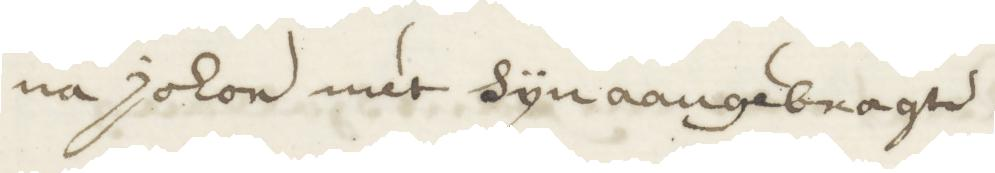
na johor met sijn aangebragte
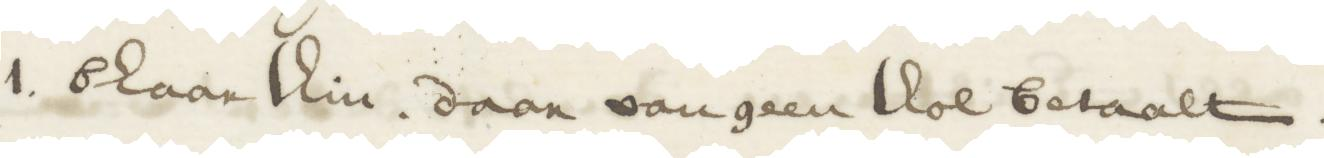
1. bhaar thin. daar van geen thol betaalt
